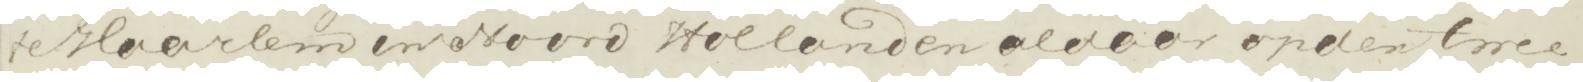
te Haarlem in Noord Holland en aldaar op den twee
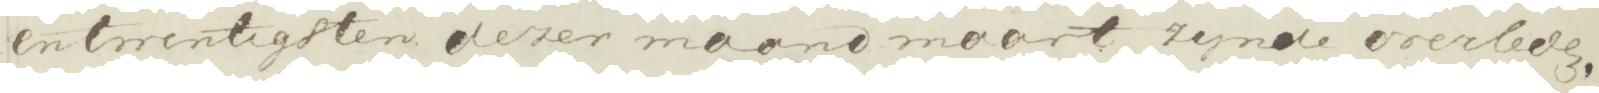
en twintigsten, dezer maand maart zynde overleden,
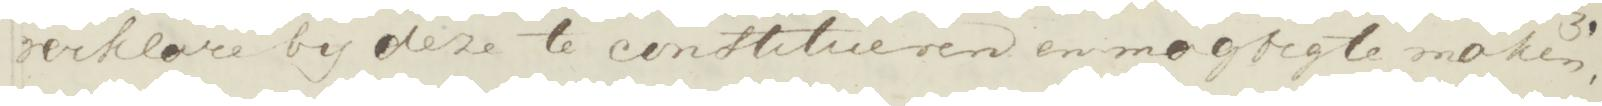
verklare by deze te constitueren en magtig te maken,
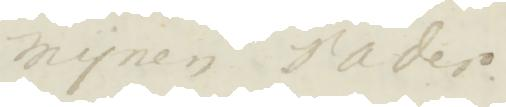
mijnen vader.
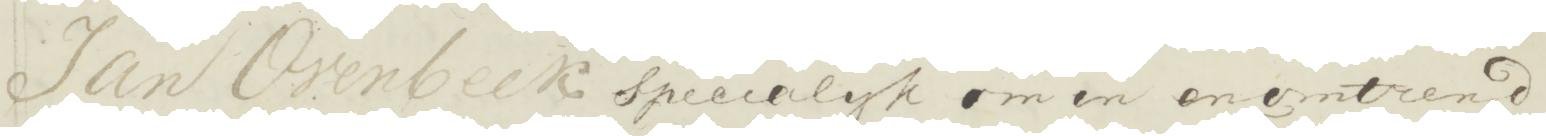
Ian Ovenbeek specialyk om in en omtrend
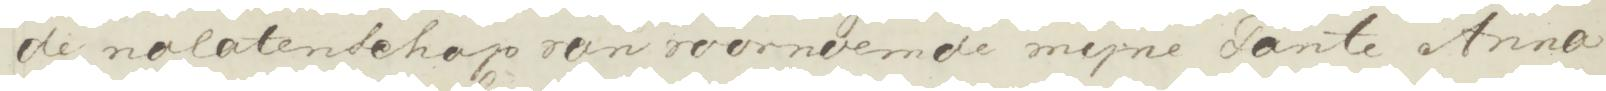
de nalatenschap van voornoemde myne Tante Anna
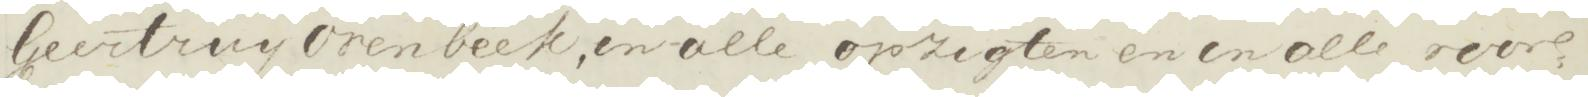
Geertruy Ovenbeek, in alle opzigten en in alle voor
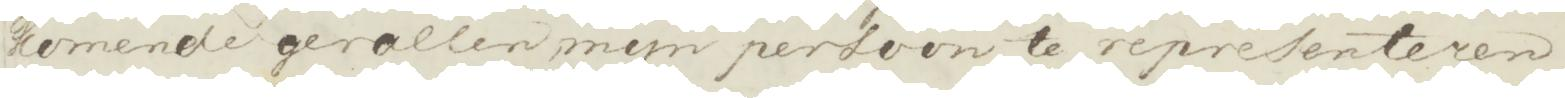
komende gevallen, myn persoon te representeren
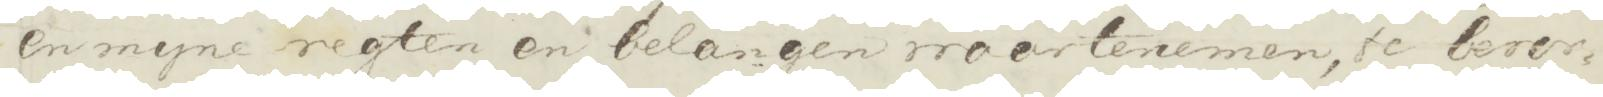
en myne regten en belangen waartenemen, te bevor„
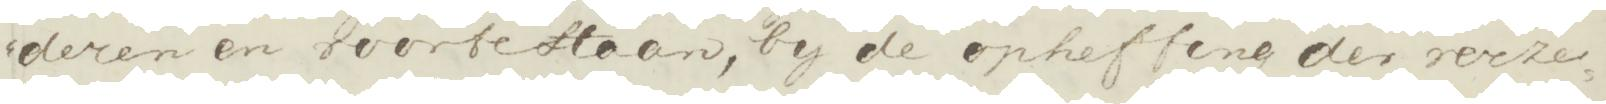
deren en voortestaan, by de opheffing der verze=
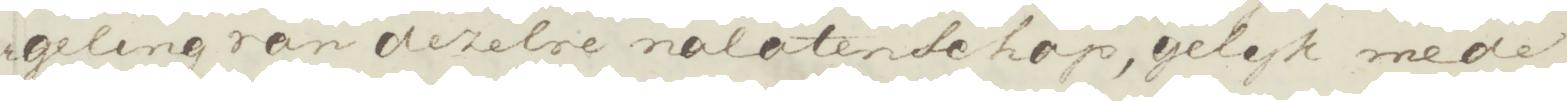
geling van dezelve nalatenschap, gelyk mede
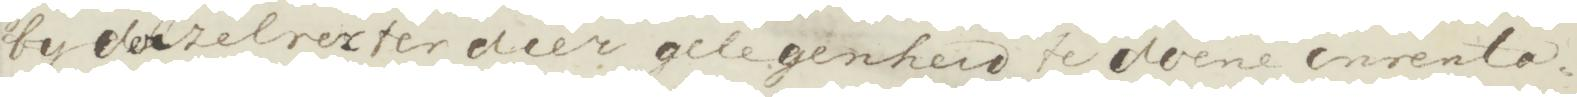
by derzelver ter dier gelegenheid te doene inventa
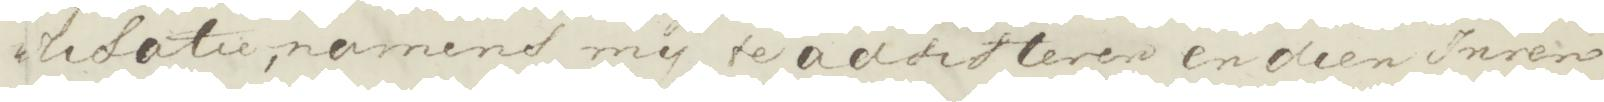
„risatie, namens my te adsisteren en dien Inven
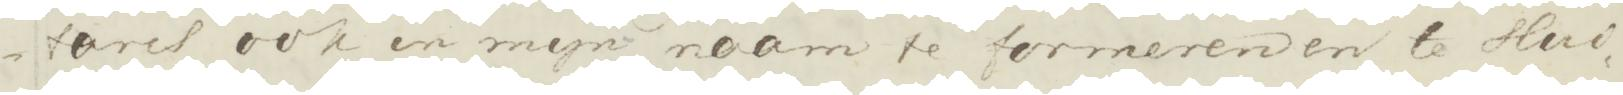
„taris ook in myn naam te formeren en te slui=
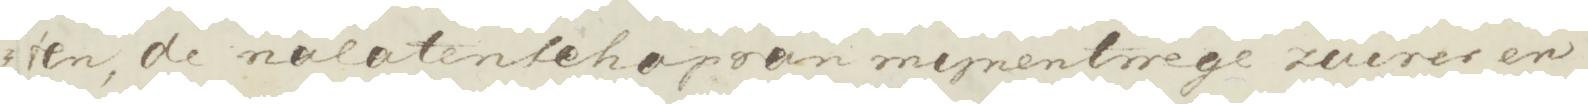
ten, de nalatenschap van mynentwege zuiver en
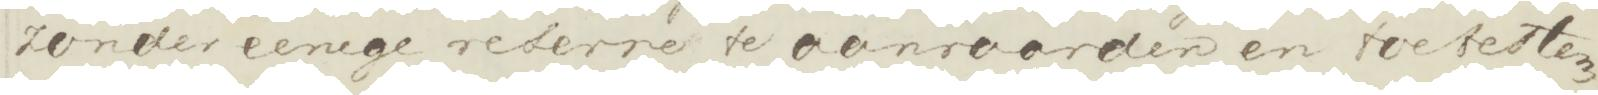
zonder eenige reserve te aanvaarden en toetestem
